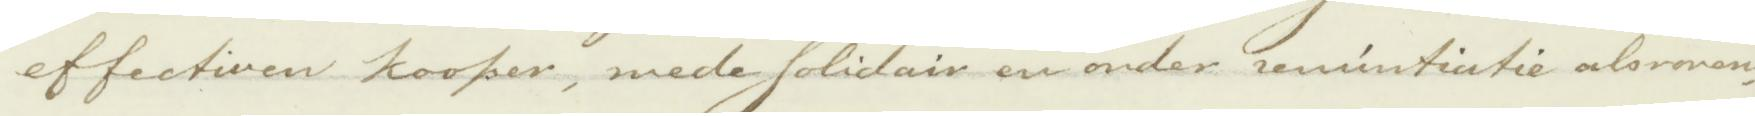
effectiven kooper, mede solidair en onder Renuntiatie als voren
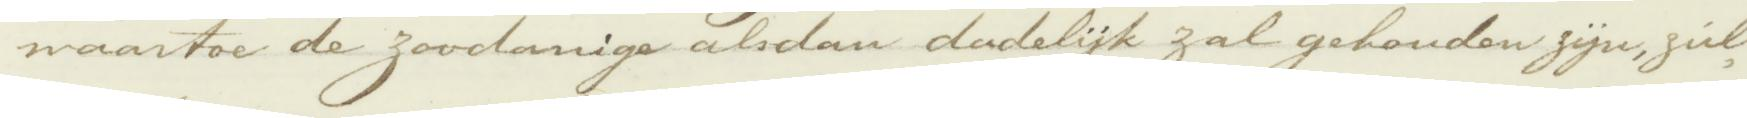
waartoe de zoodanige alsdan dadelijk zal gehouden zijn, zul=
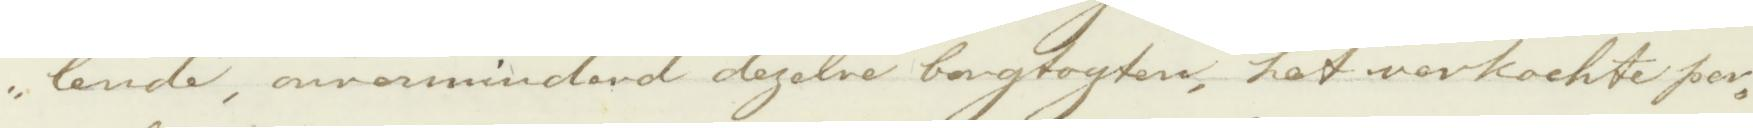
„lende, onverminderd dezelve borgtogten, het verkochte per=
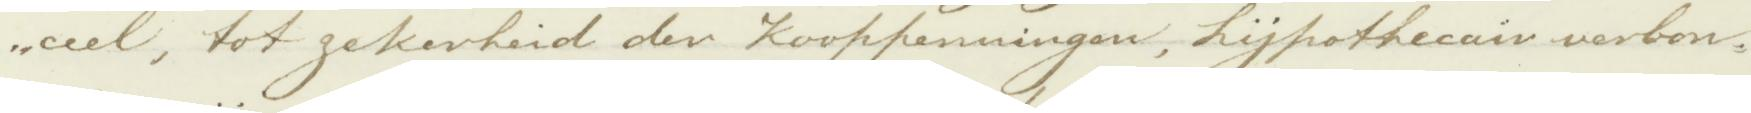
„ceel, tot zekerheid der kooppenningen, hijpothecair verbon=
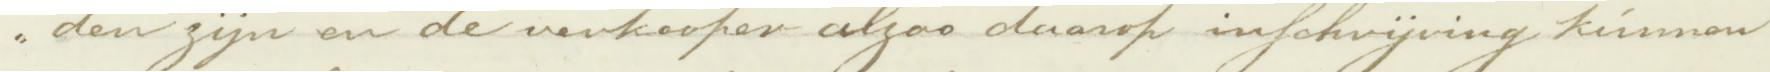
„den zijn en de verkooper alzoo daarop inschrijving kunnen
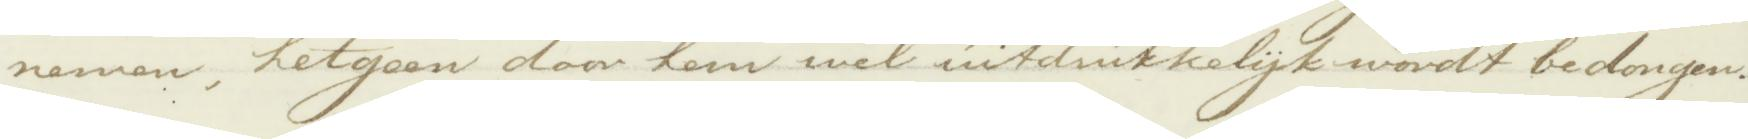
nemen, hetgeen door hem wel uitdrukkelijk wordt bedongen
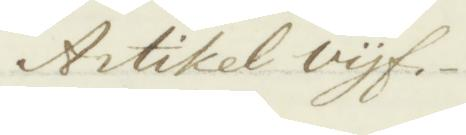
Artikel vijf. -
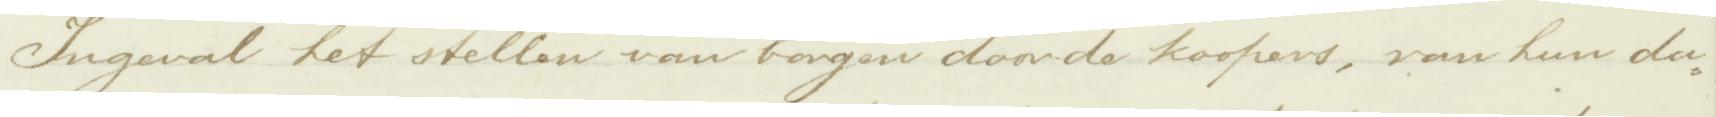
Ingeval het stellen van borgen door de koopers, van hun da=
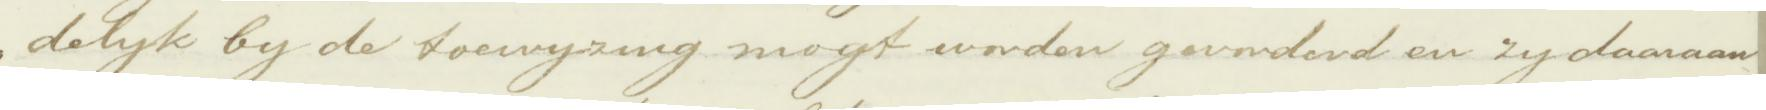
„delyk by de toewyzing mogt worden gevorderd en zy daaraan
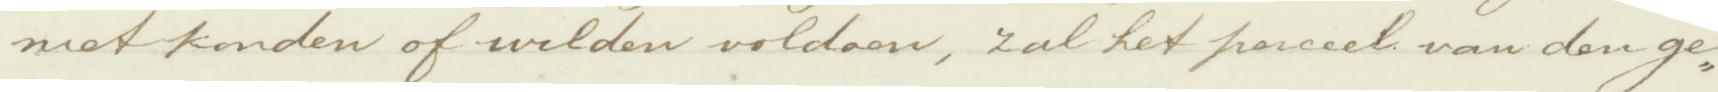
niet konden of wilden voldoen, zal het perceel van den ge„
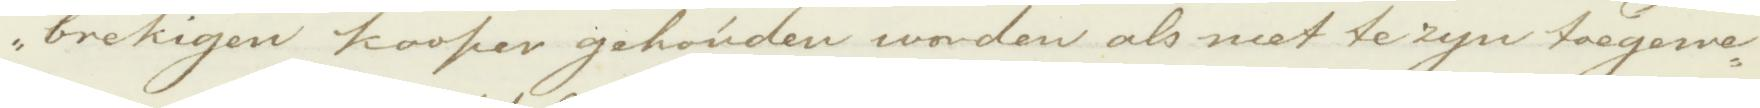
„brekigen kooper gehouden worden als niet te zyn toegewe„
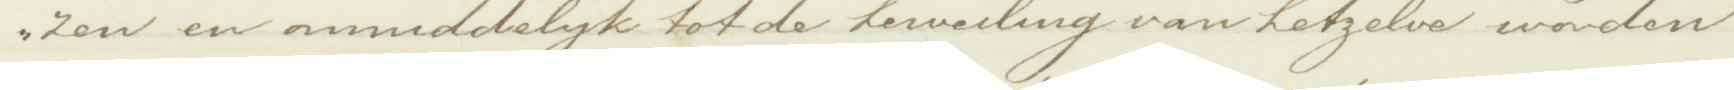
„zen en onmiddelyk tot de herveiling van hetzelve worden
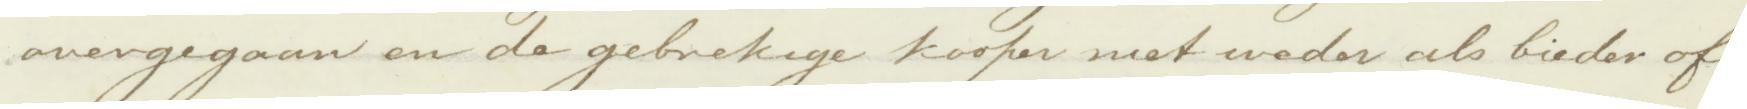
overgegaan en de gebrekige kooper niet weder als bieder of
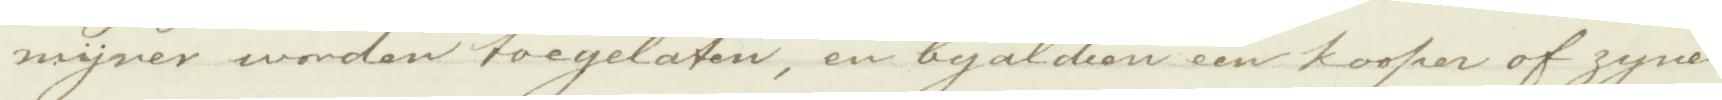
mijner worden toegelaten, en by aldien een kooper of zyne
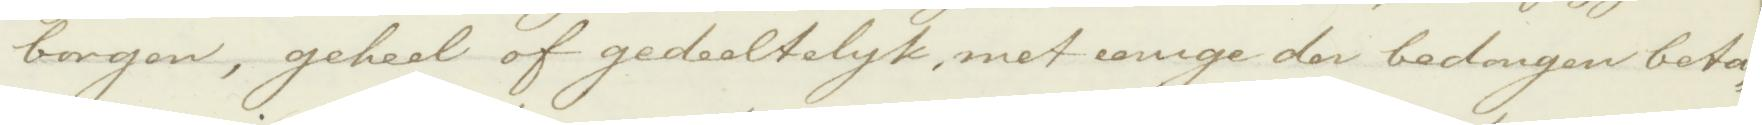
borgen, geheel of gedeeltelyk, met eenige der bedongen beta„
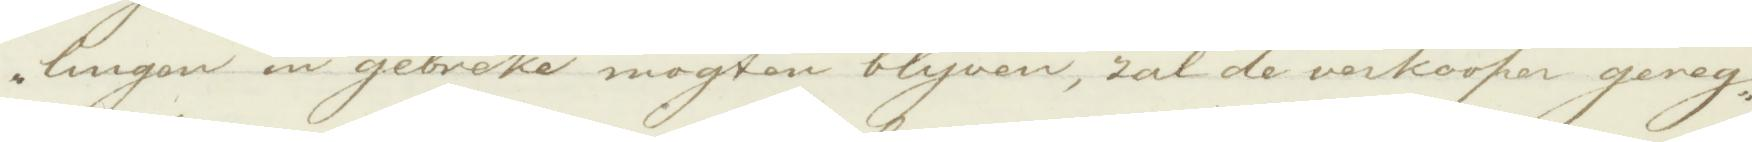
„lingen in gebreke mogten blyven, zal de verkooper gereg
